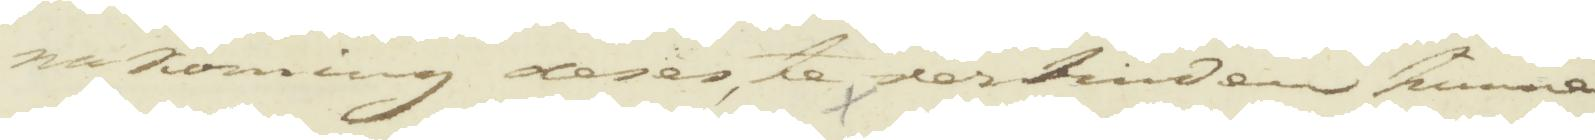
nakoming dezes, te verbinden hunne
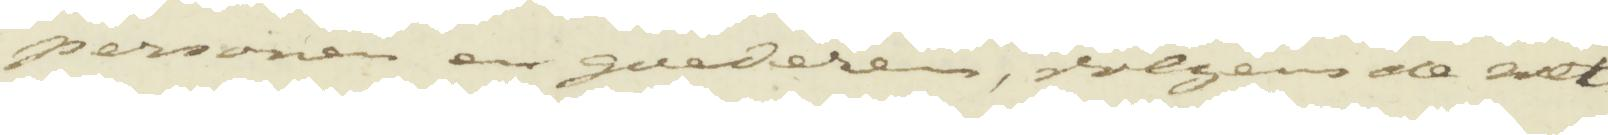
personen en goederen, volgens de wet
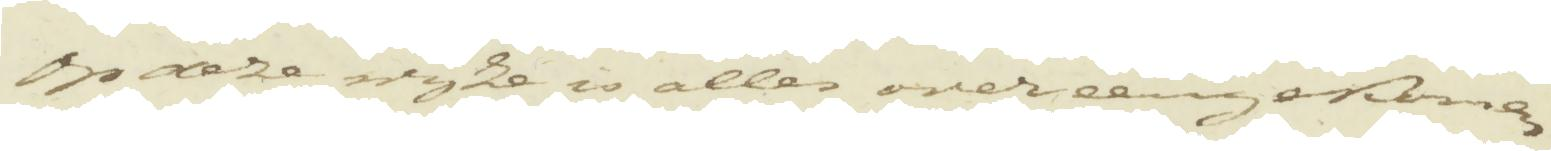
op deze wyze is alles over eengekomen
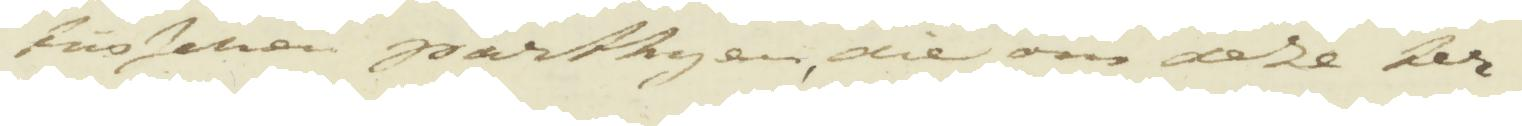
tusschen parthyen, die om deze ter
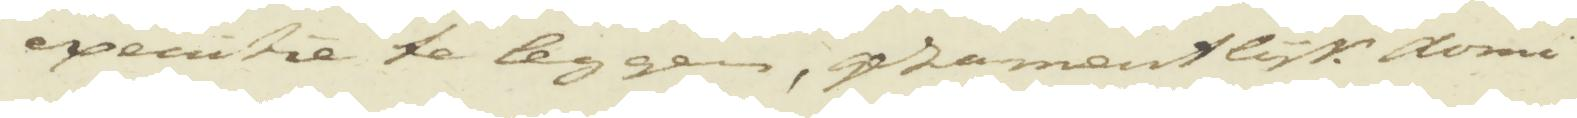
executie te leggen, gezamentlijk domi
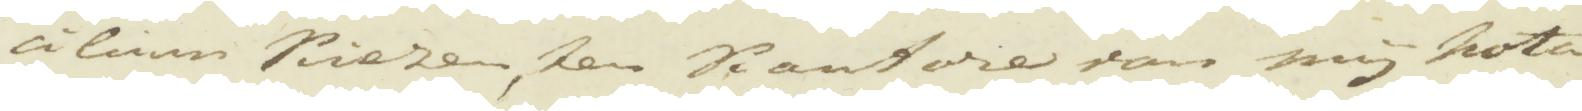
cilum kiezen, ten kantore van mij nota
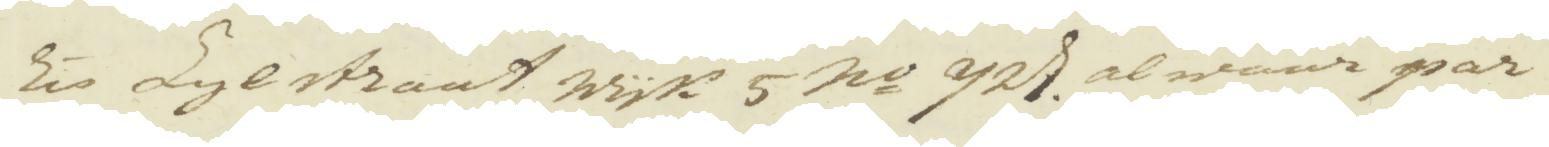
ris Zylstraat wijk 5 N=o 72h. alwaar par
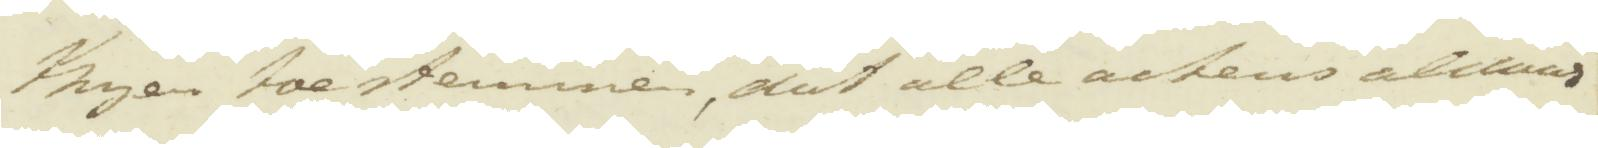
thyen toestemmen, dat alle actens aldaar
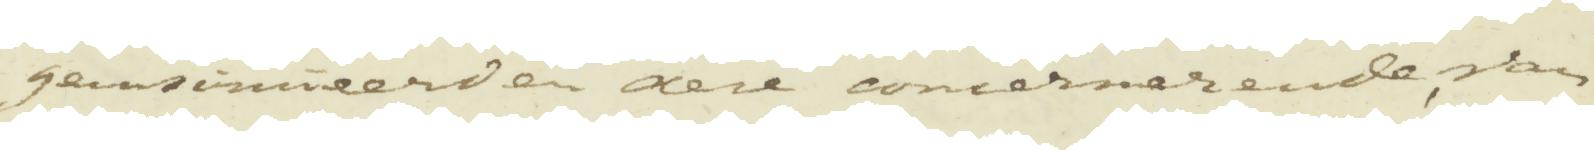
geinsinueerd en deze concernerende, van
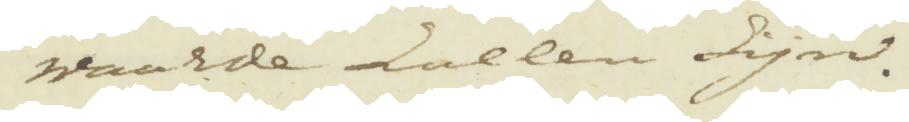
waarde zullen zijn.
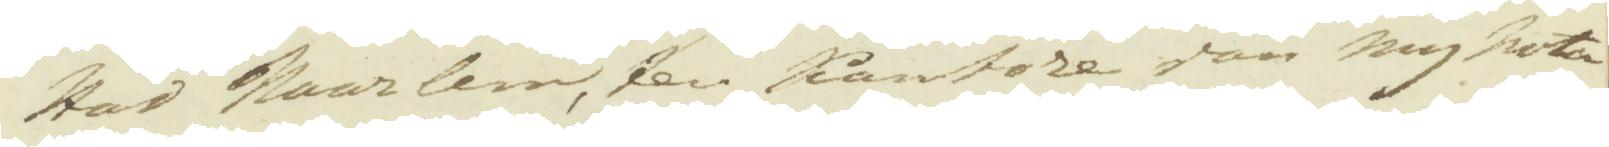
stad Haarlem, ten Kantore van my nota
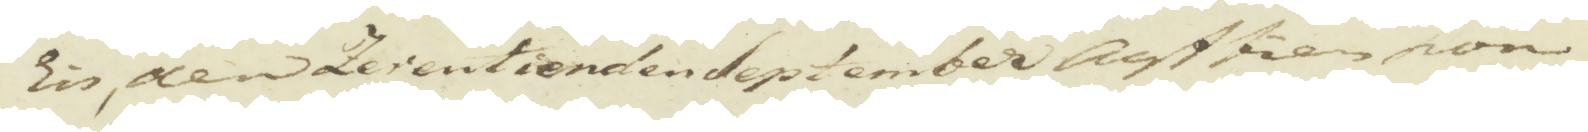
ris, den Zeventienden september agttien hon
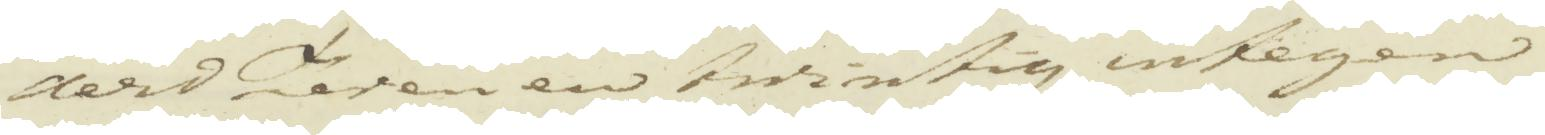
dert Zeven en twintig, in tegen
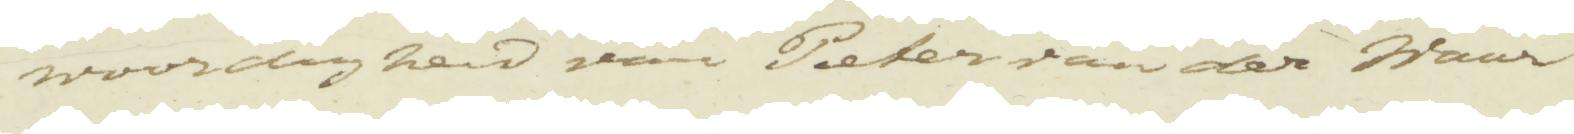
woordigheid van Pieter van der Waar
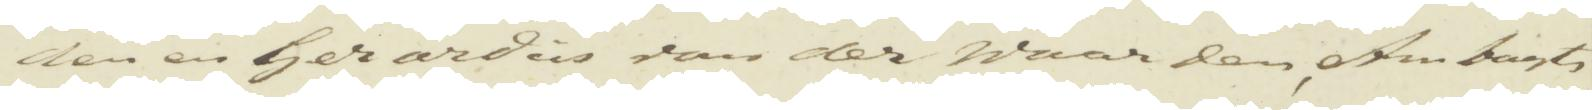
den en Gerardus van der Waarden, Ambagts
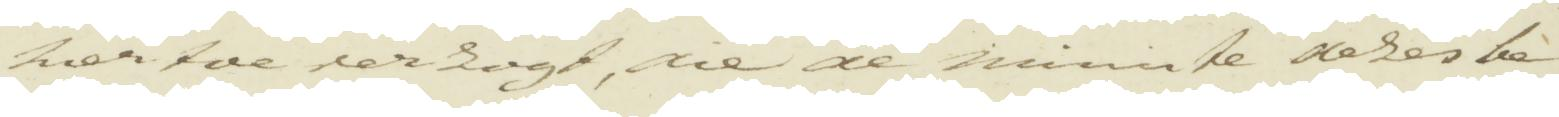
hier toe verzogt, die de minute dezes be
